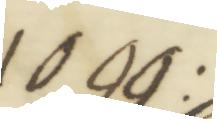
1099:
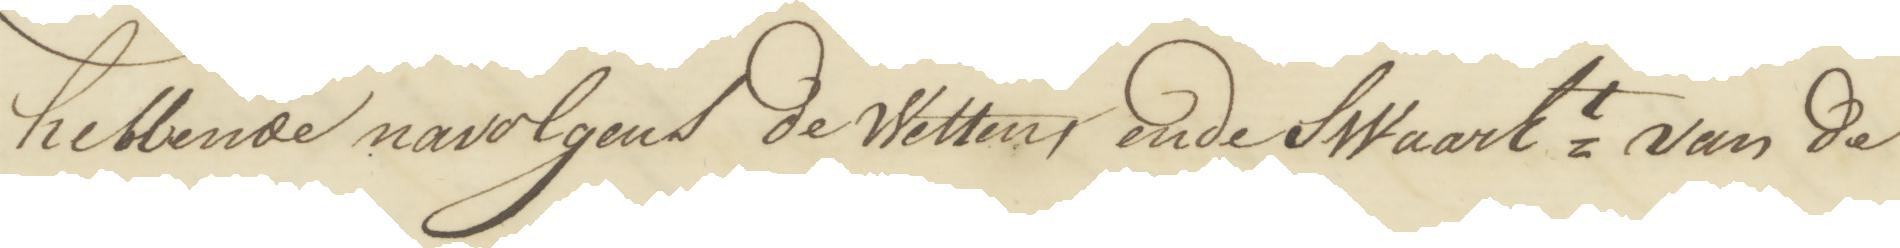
hebbende navolgens de wetten, ende swaarh=t van de
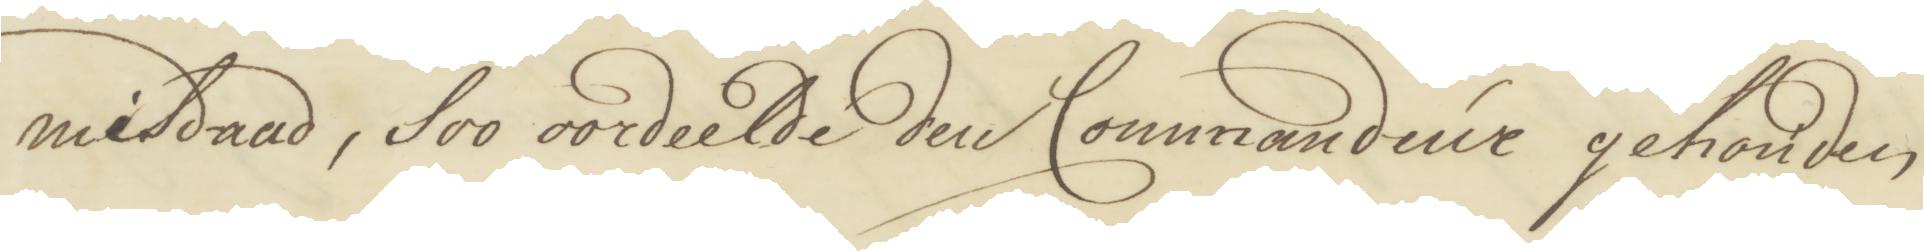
misdaad, soo oordeelde den Commandeur gehouden
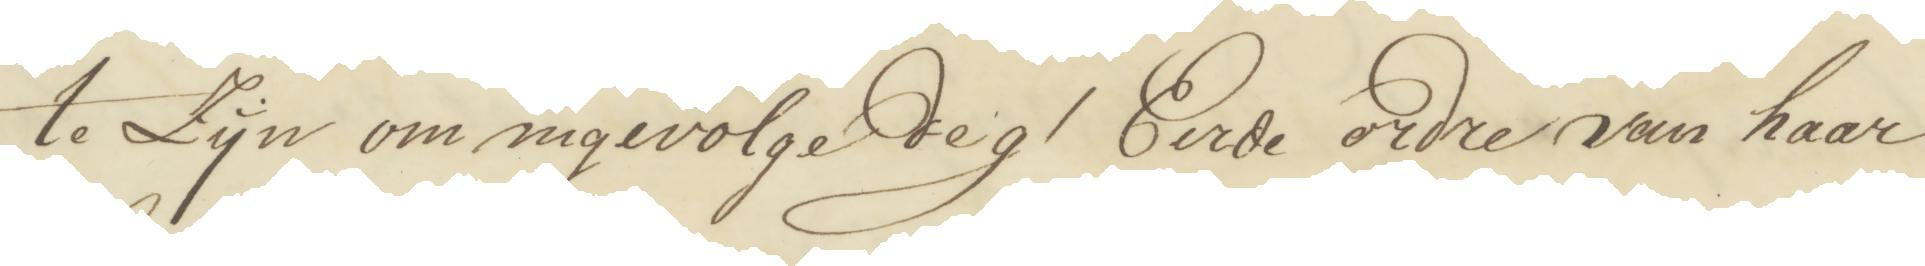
te zijn om ingevolge de g’ Eerde ordre van haar
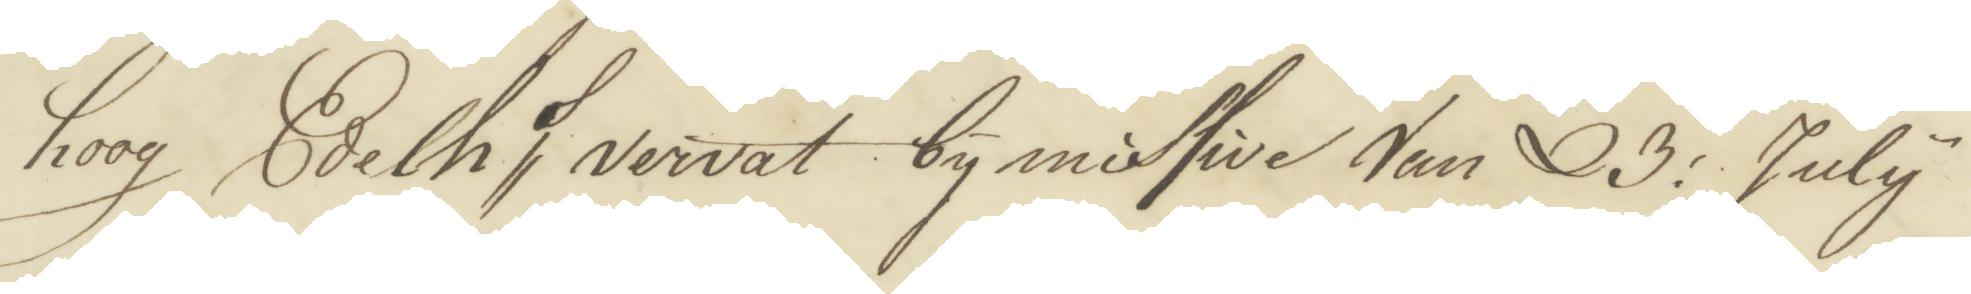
hoog Edelh„s vervat bij missive van 23:' Julij
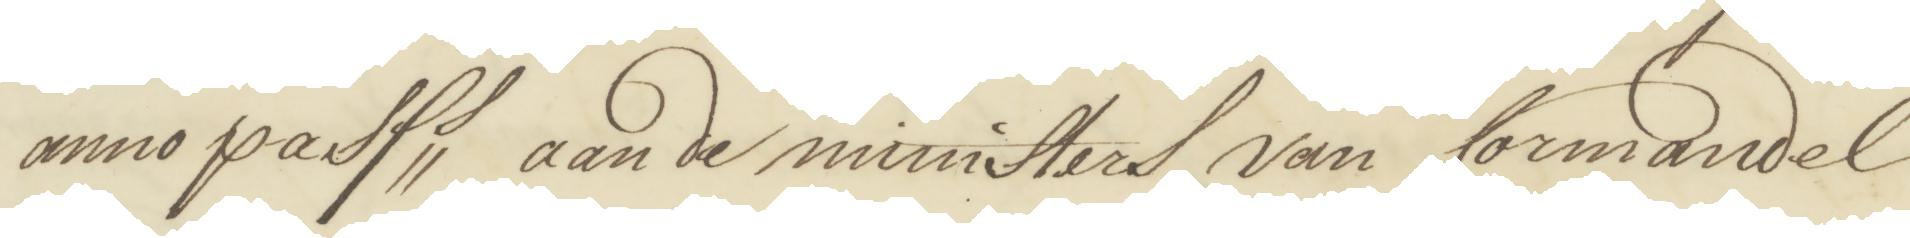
anno pass„s aan de ministers van Cormandel
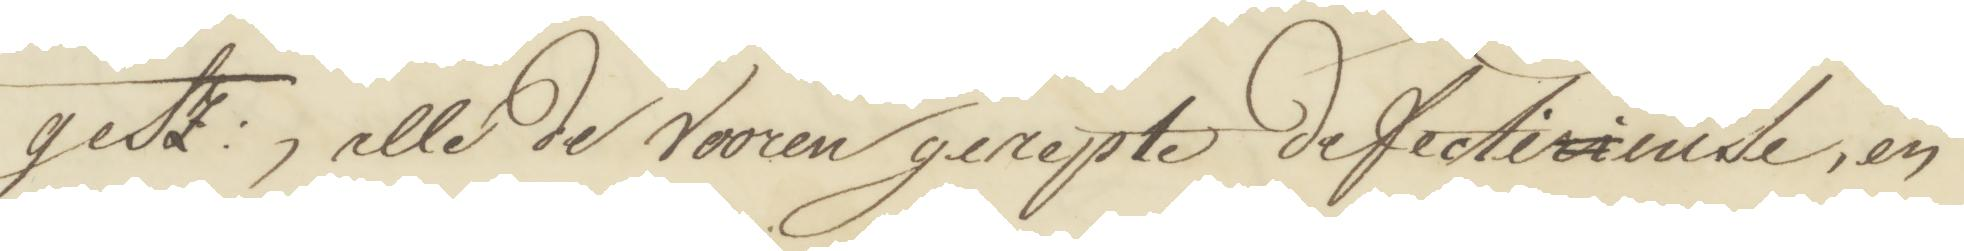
gesz:, alle de vooren gerepte defectirieuse, en
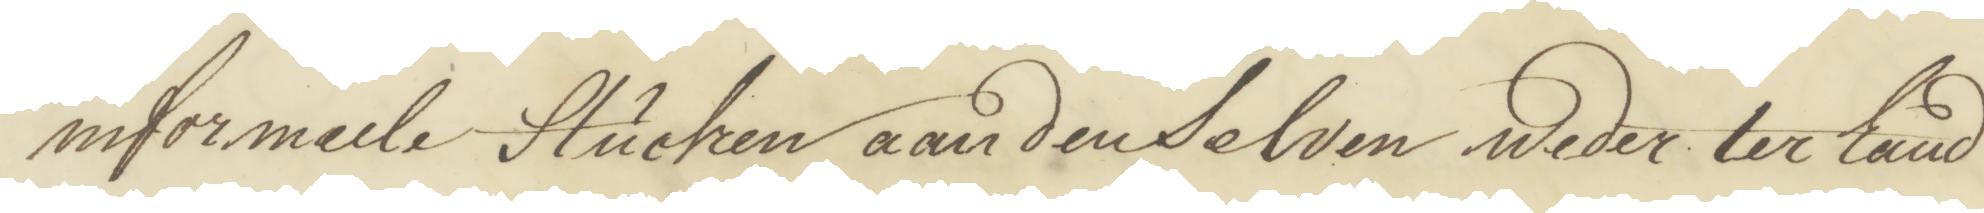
informeele stucken aan denselven weder ter hand
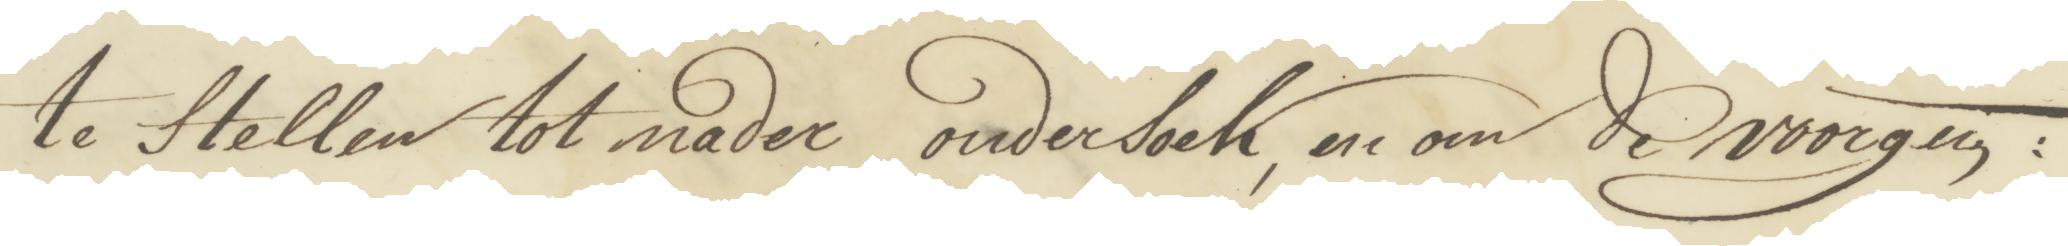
te stellen tot nader ondersoek, en om de voorgem:
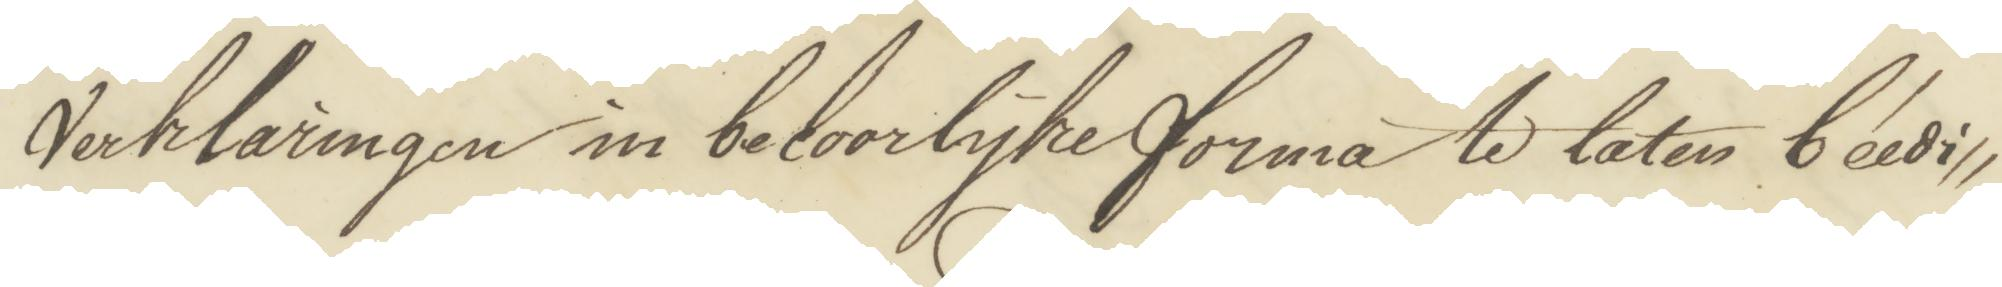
Verklaringen in behoorlijke forma te laten b'eedi„
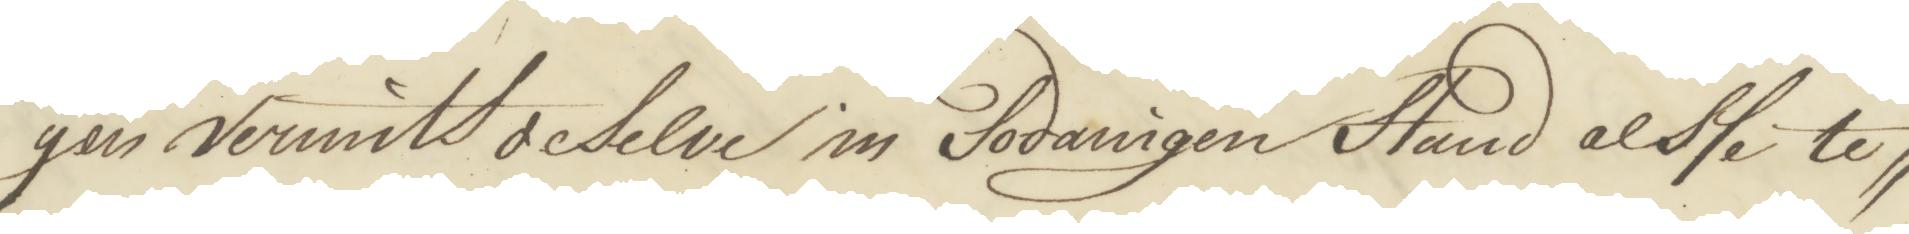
gen vermits deselve in sodanigen stand alsse te
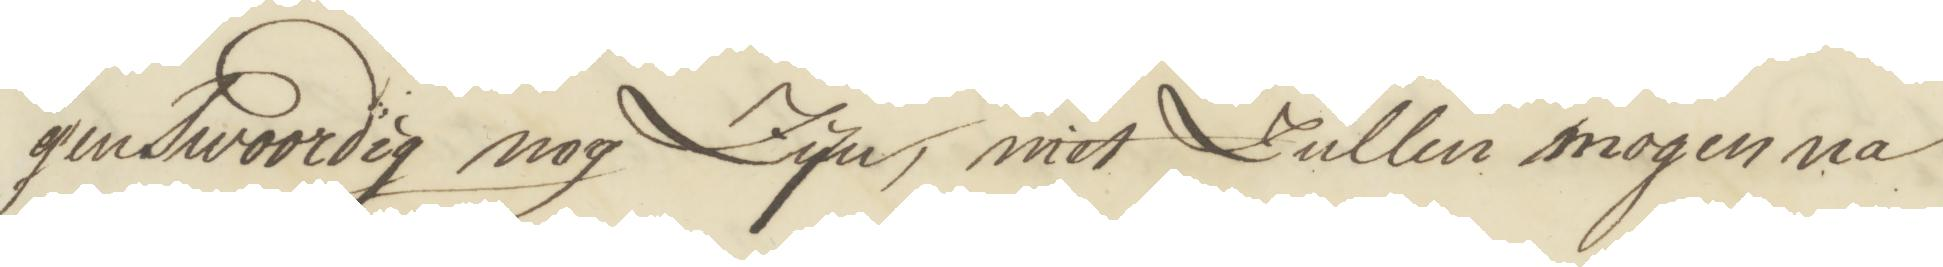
genswoordig nog zijn, niet zullen mogen na
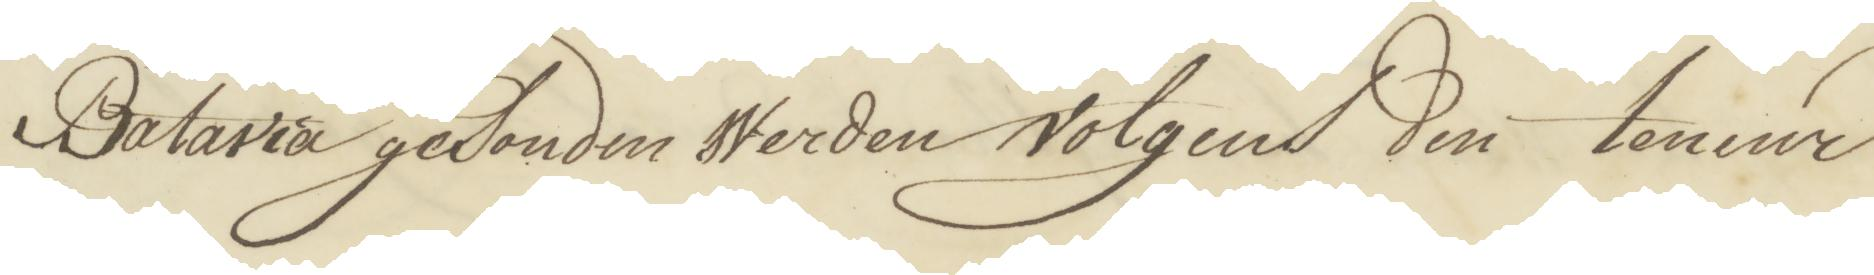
Batavia gesonden werden volgens den teneur
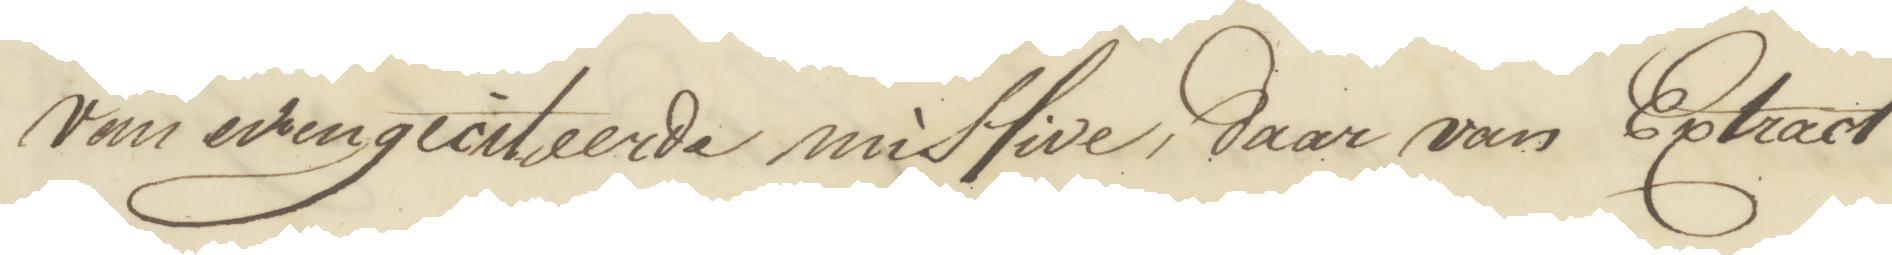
van evengeciteerde missive, daar van Extract
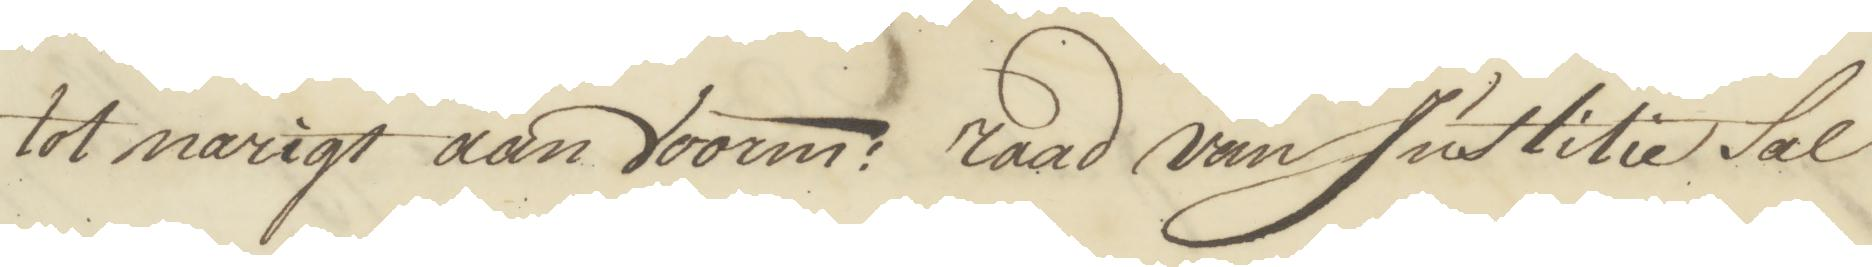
tot narigt aan voorm: raad van Justitie sal
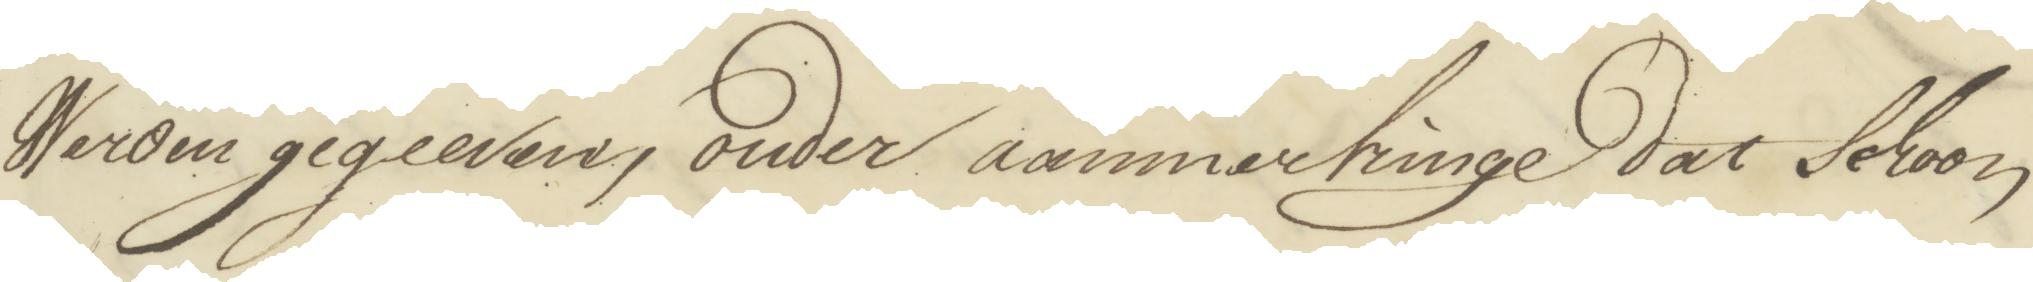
werden gegeeven, onder aanmerkinge dat schoon
